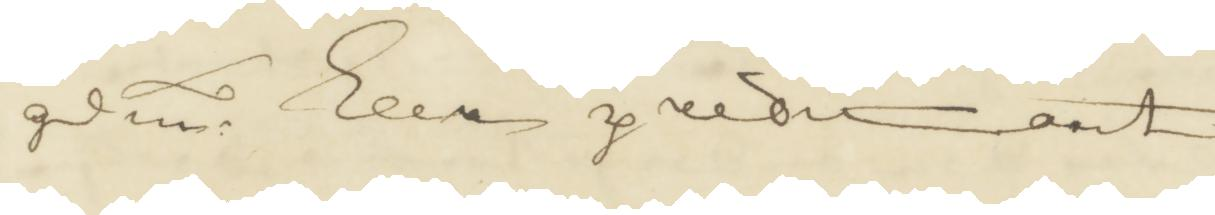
gem: heer predicant
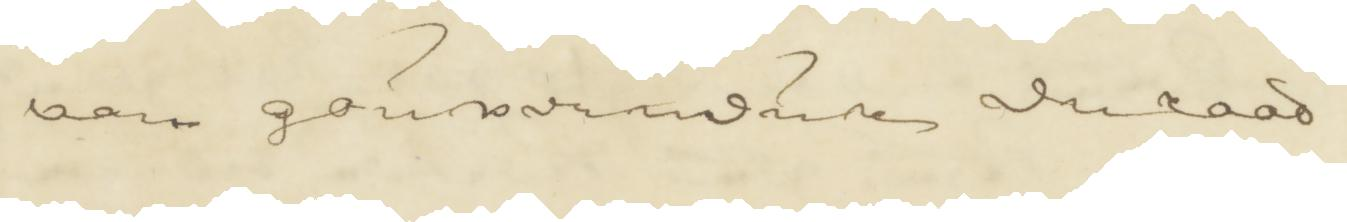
van gouverneur en raad
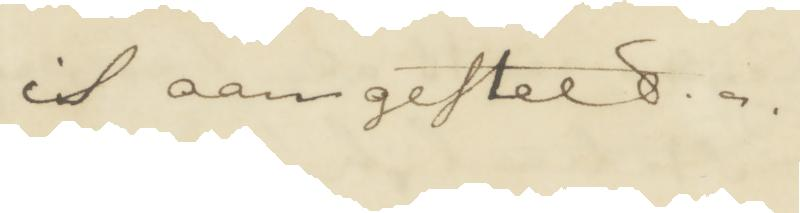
is aan gesteld.~.
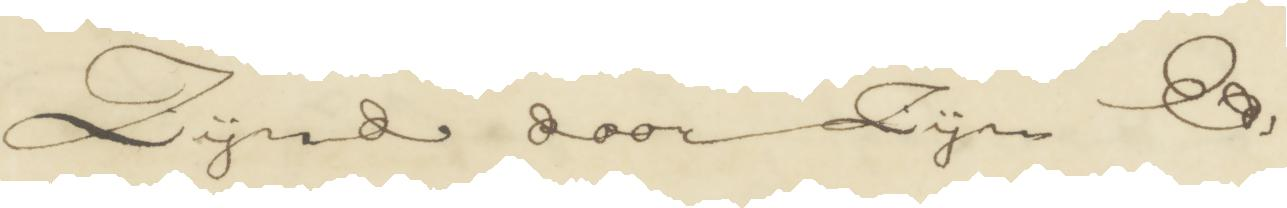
Zijnde door zijn Ed:
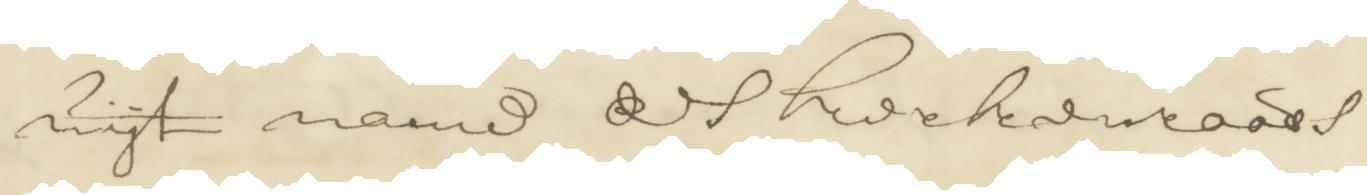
uijt name des kerkenraads
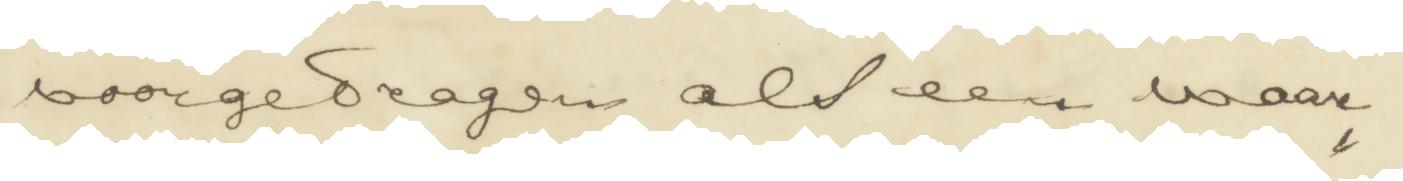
voorgedragen, als een waar„
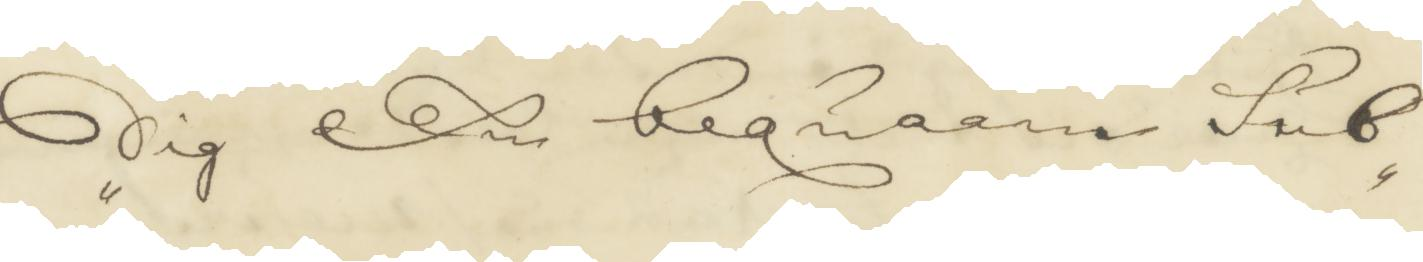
dig En bequaam sub„
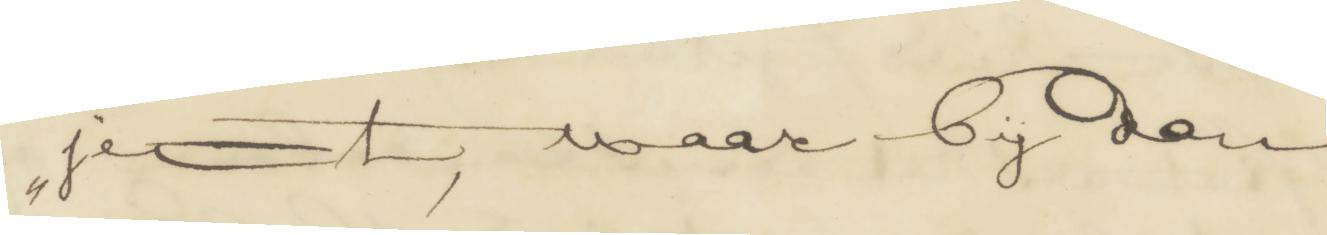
„ject, waar bij dan
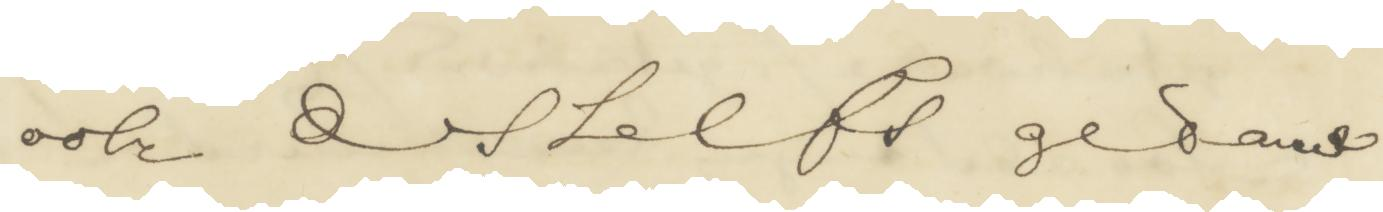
ook desselfs gedane
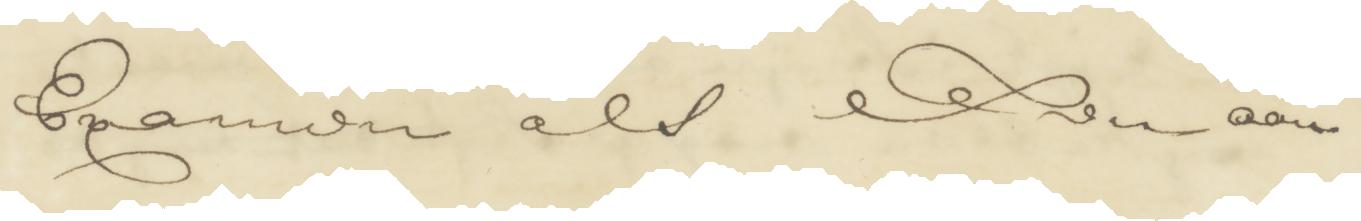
Examen als Een aan
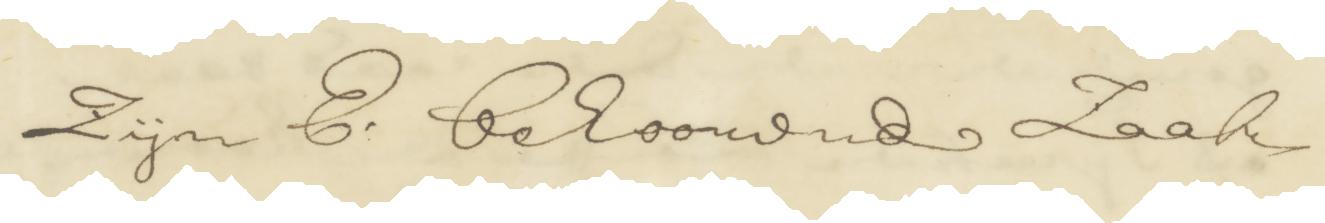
zijn E: behoorende zaak
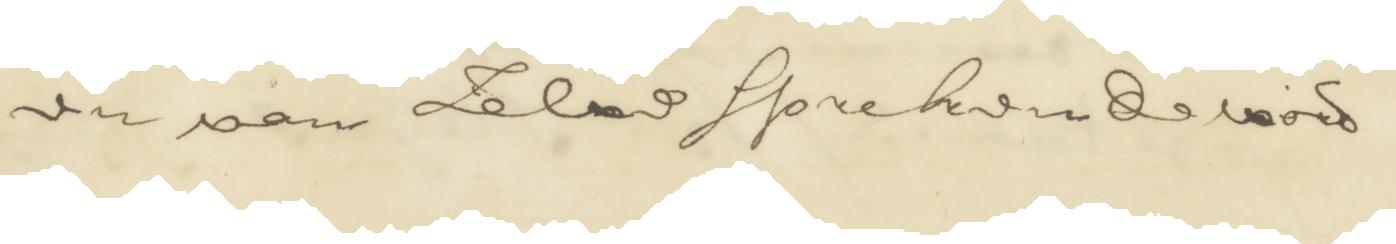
en van zelve sprekende word
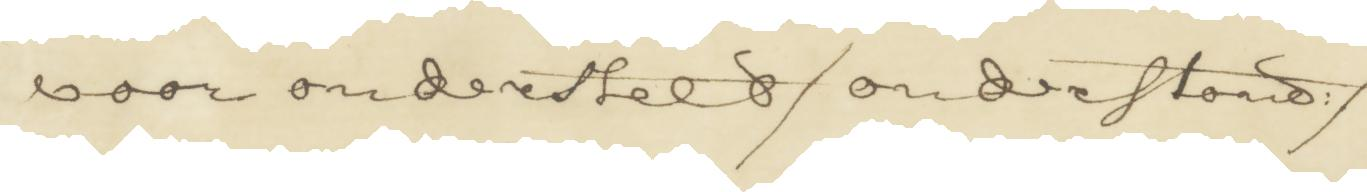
voor ondersteld / onderstond:/
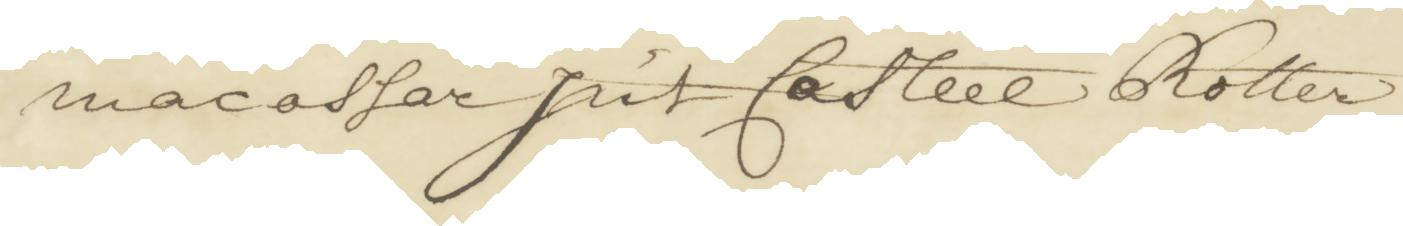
macassar Jnt Casteel Rotter
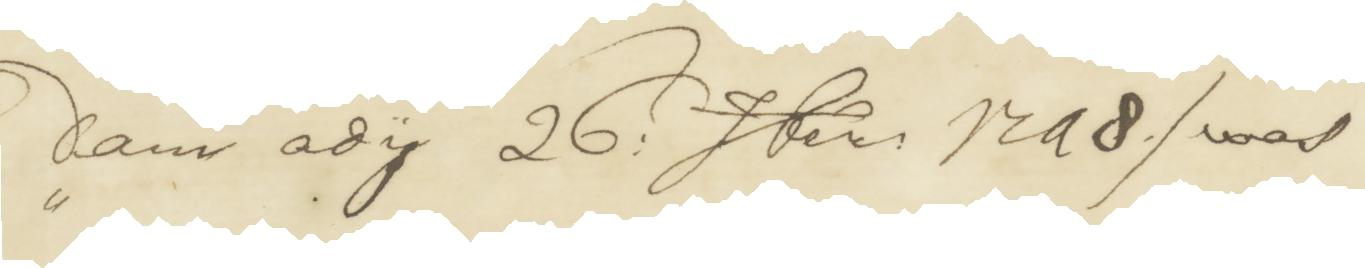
„dam adij 26:' 7ber: 1748./ was
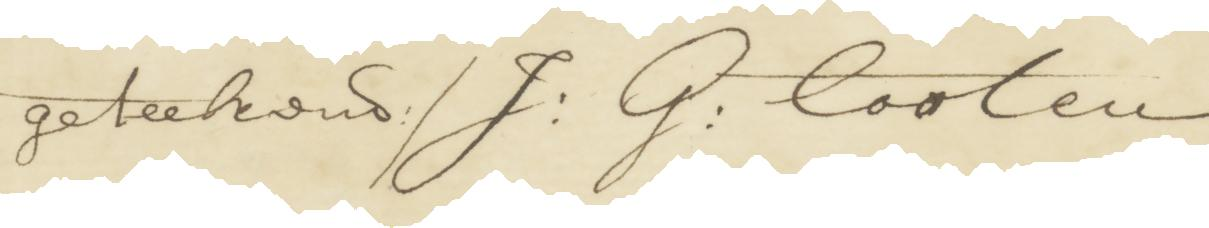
geteekend:/ J: G: looten
